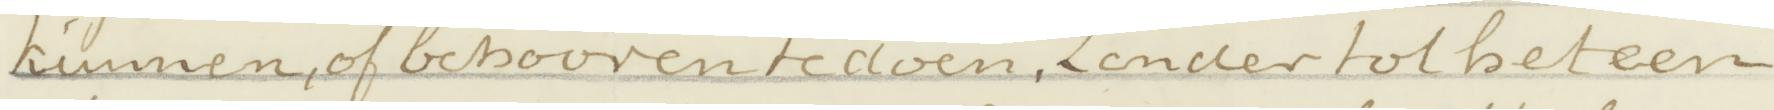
kunnen, of behooren te doen, zonder tot het een
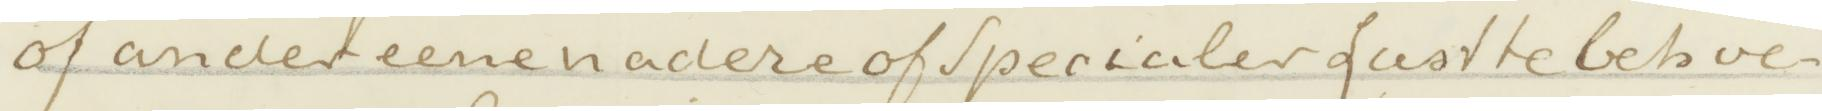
of ander eene nadere of specialer Last te behoe-
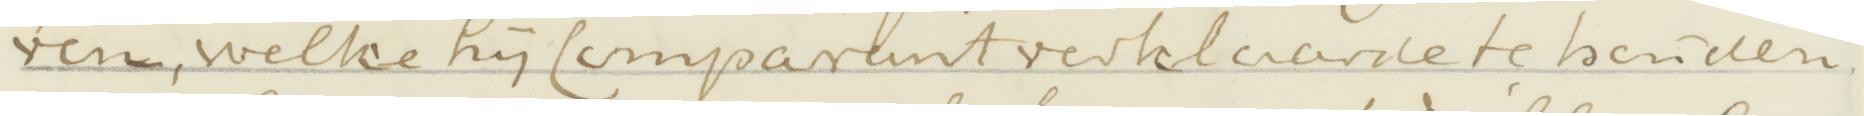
ven, welke hij Comparant verklaarde te houden,
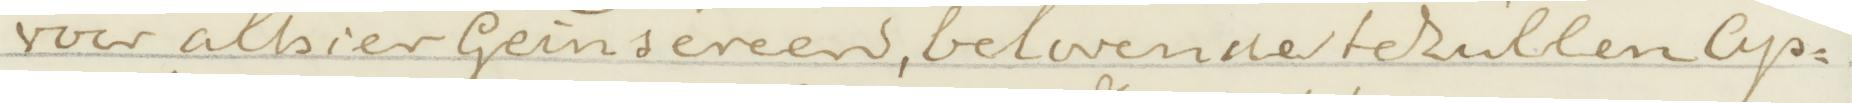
voor alhier Geinsereerd, belovende te zullen Ap=
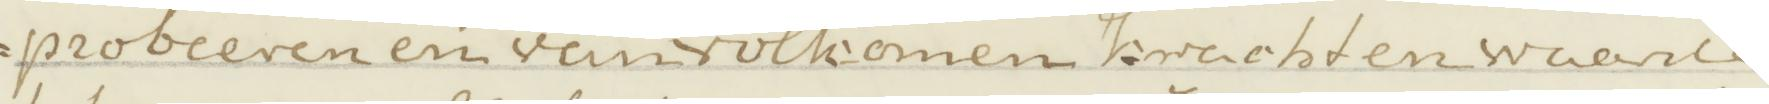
=probeeren en van volkomen kracht en waarde
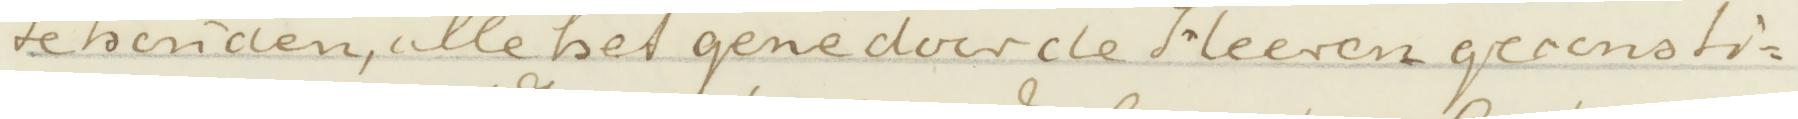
te houden, alle het gene door de Heeren geconsti=
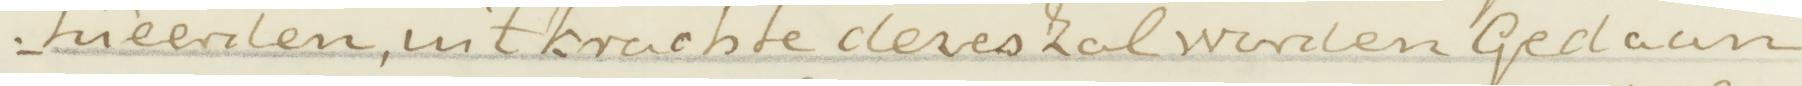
=tueerden, uit krachte dezes zal worden Gedaan
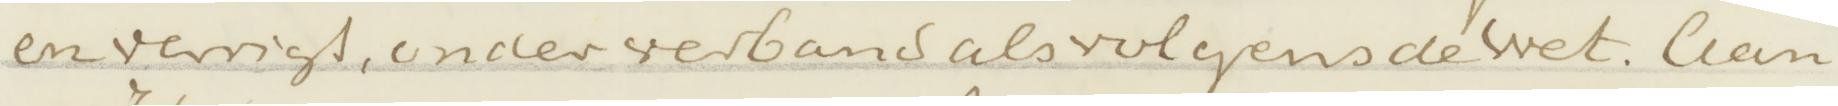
en verrigt, onder verband als volgens de Wet. Aan
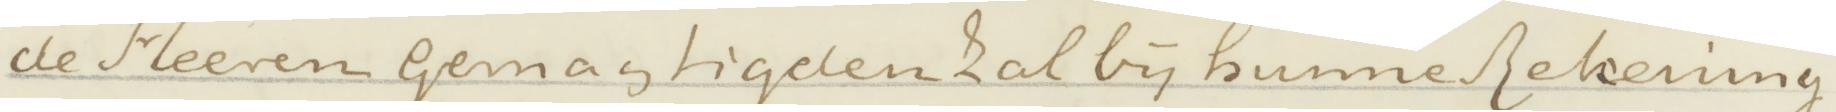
de Heeren Gemagtigden zal bij hunne Rekening
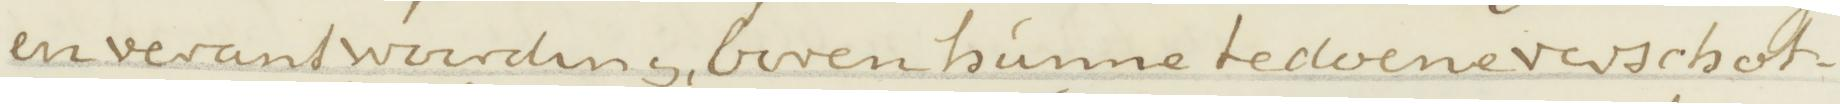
en verantwoording, boven hunne te doene verschot-
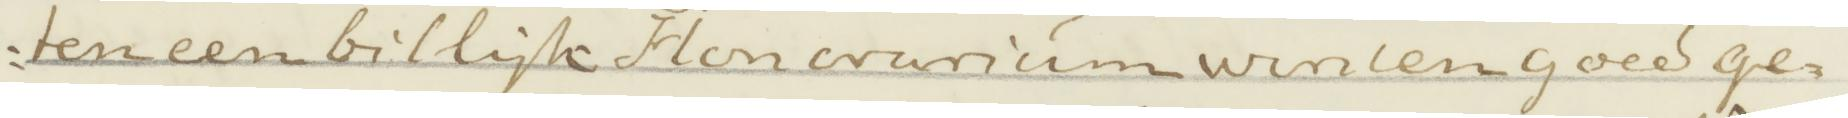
=ten een billijk Honorarium worden goed ge=
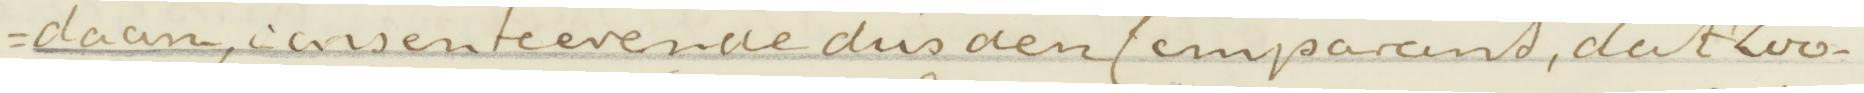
=daan, consenteerende dus den Comparant, dat zoo=
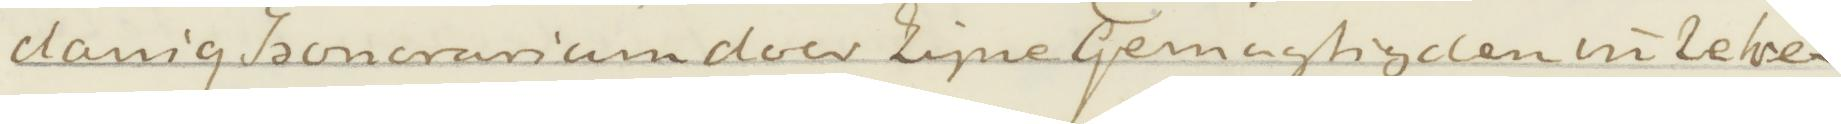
danig honorarium door Zijne Gemagtigden in reke=
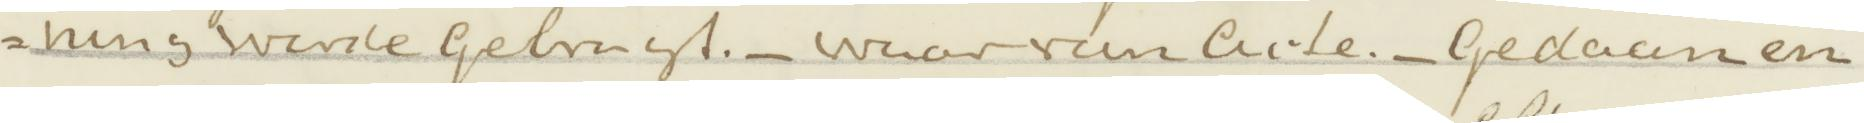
=ning worde gebragt. - waarvan Acte. - Gedaan en
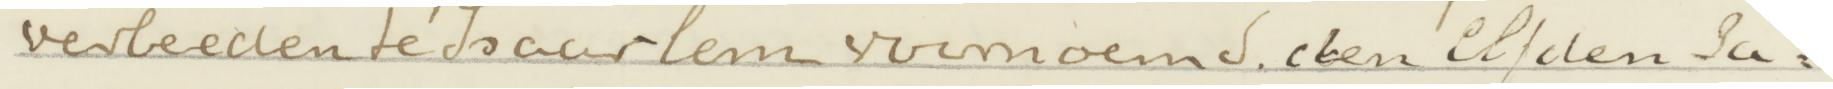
verleeden te haarlem voornoemd, den Elfden Ia=
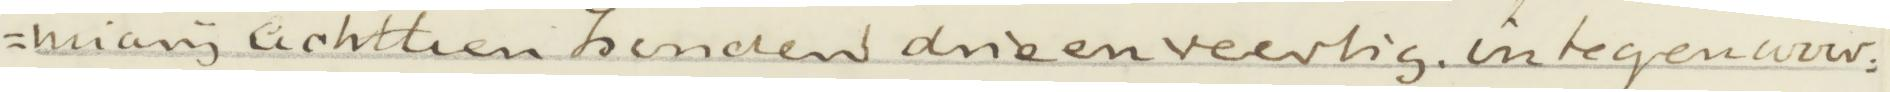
=nuarij achttien honderd drie en veertig, in tegenwoor=
